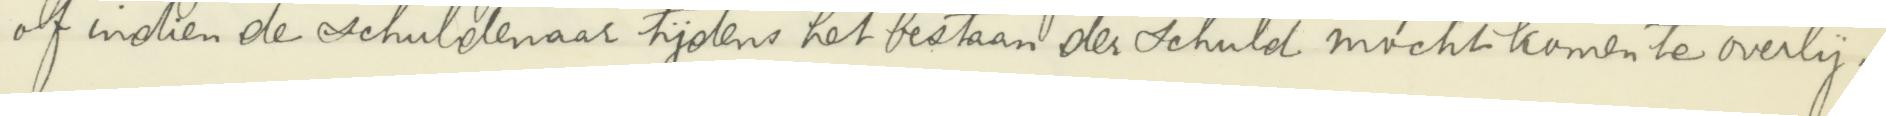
of indien de schuldenaar tijdens het bestaan der schuld mocht komen te overlij„
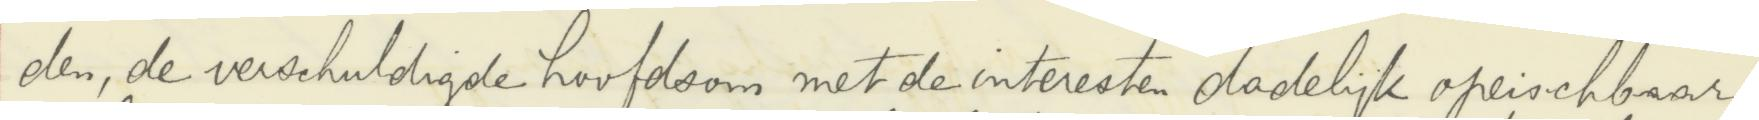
den, de verschuldigde hoofdsom met de interesten dadelijk opeischbaar
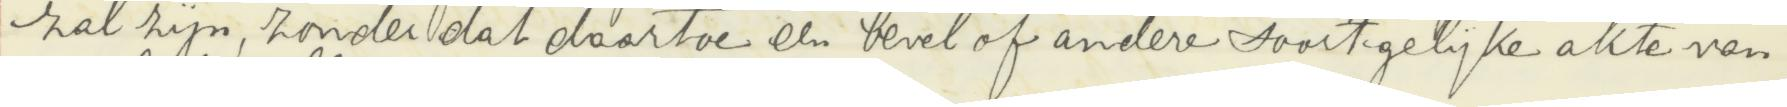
zal zijn, zonder dat daartoe een bevel of andere soortgelijke akte van
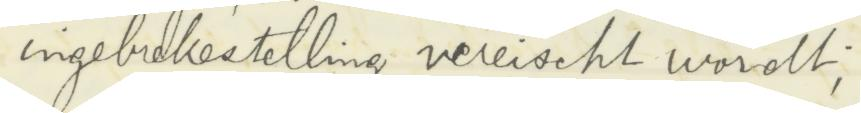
ingebrekestelling vereischt wordt;
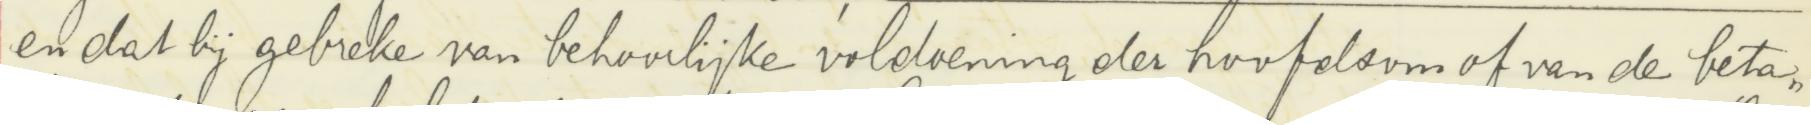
en dat bij gebreke van behoorlijke voldoening der hoofdsom of van de beta„
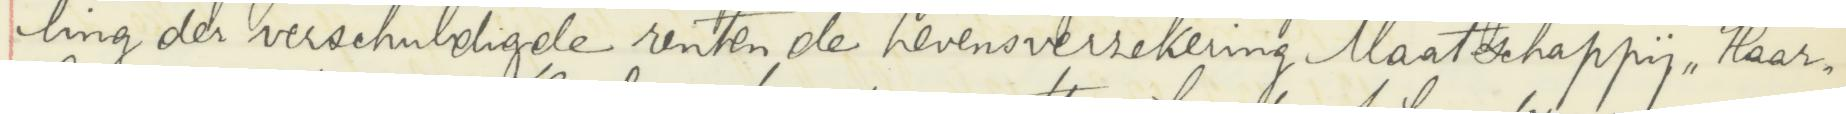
ling der verschuldigde renten de Levensverzekering Maatschappij „Haar„
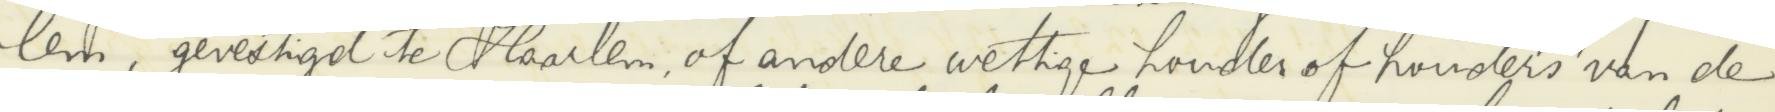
lem", gevestigd te Haarlem, of andere wettige houder of houders van de
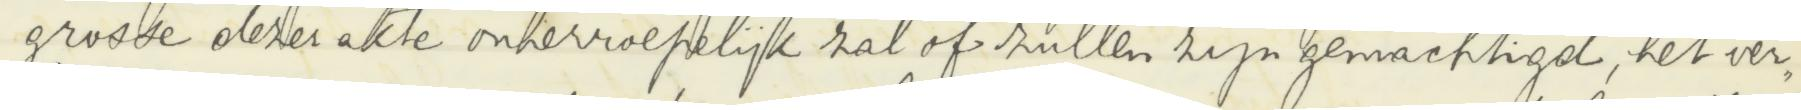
grosse dezer akte onderroepelijk zal of zullen zijn gemachtigd, het ver„
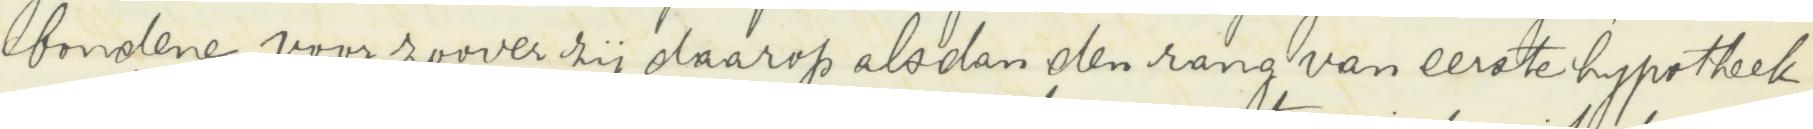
bondene voor zoover zij daarop alsdan den rang van eerste hypotheek
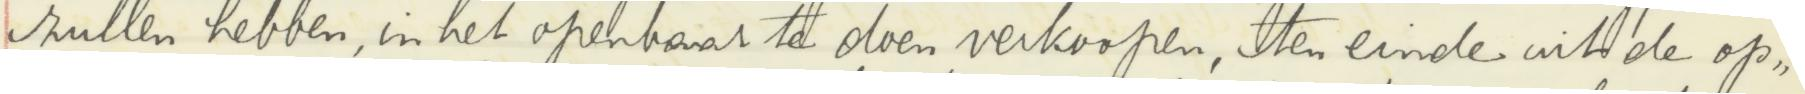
zullen hebben, in het openbaar te doen verkoopen, ten einde uit de op„
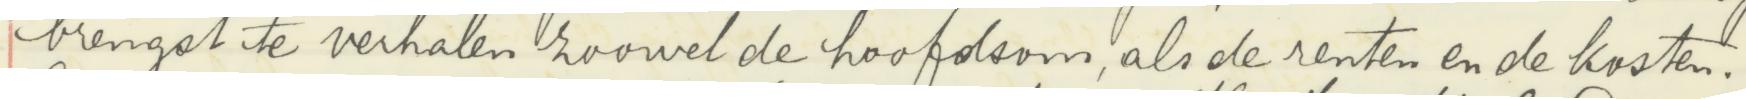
brengst te verhalen zoowel de hoofdsom, als de renten en de kosten.
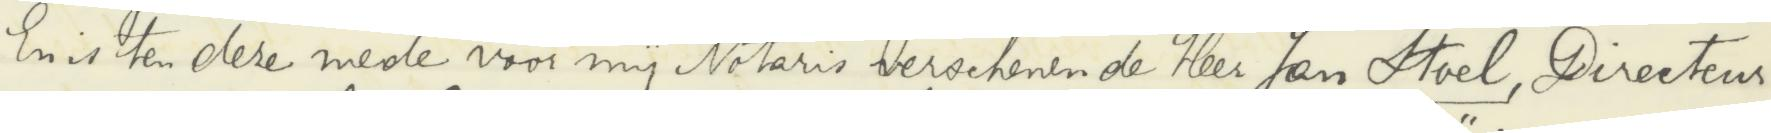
En is ten deze mede voor mij Notaris verschenen de Heer Jan Stoel, Directeur
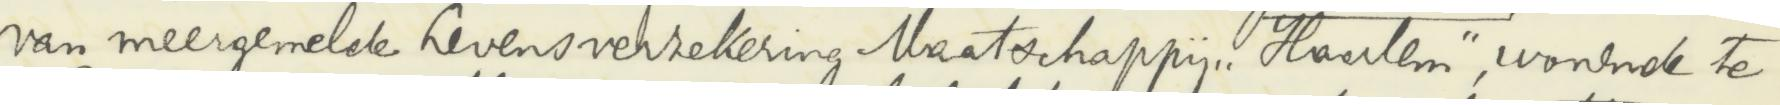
van meergemelde Levensverzekering Maatschappij, Haarlem, wonende te
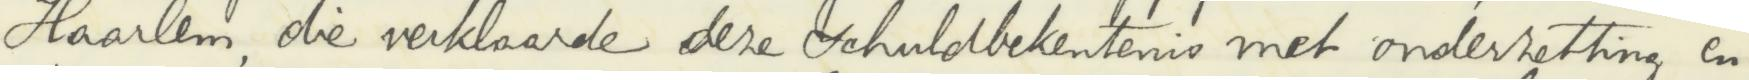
Haarlem, die verklaarde deze schuldbekentenis met onderzetting en
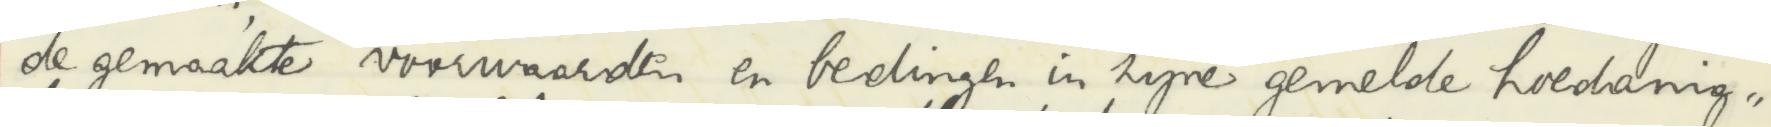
de gemaakte voorwaarden en bedingen in zijne gemelde hoedanig„
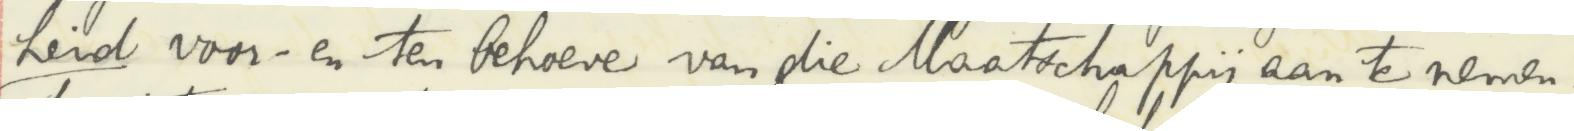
heid voor- en ten behoeve van die Maatschappij aan te nemen
